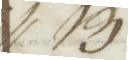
„ 13
